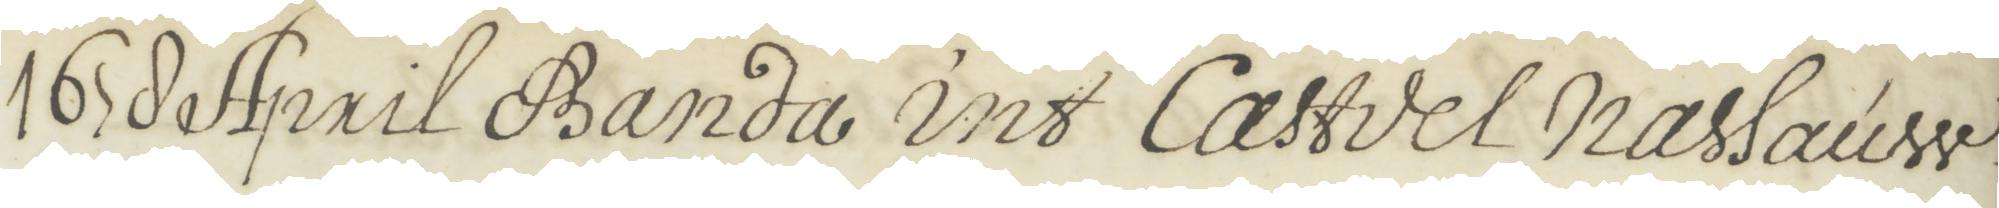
1678 April Banda in't Casteel Nassauw.
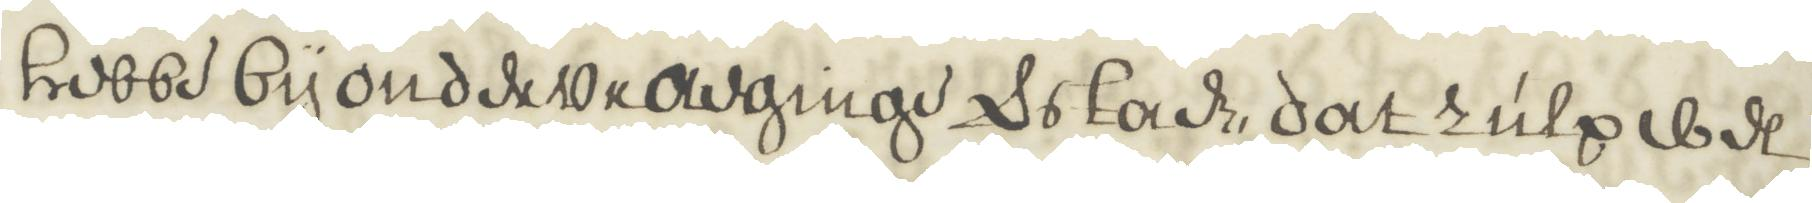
hebbe bij ondervraeginge verstaen dat zulx wel
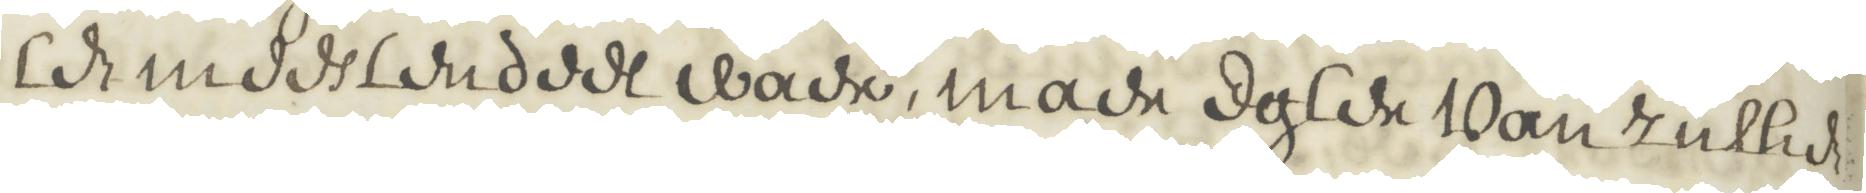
ter meestendeel waer, maer egter van zulken
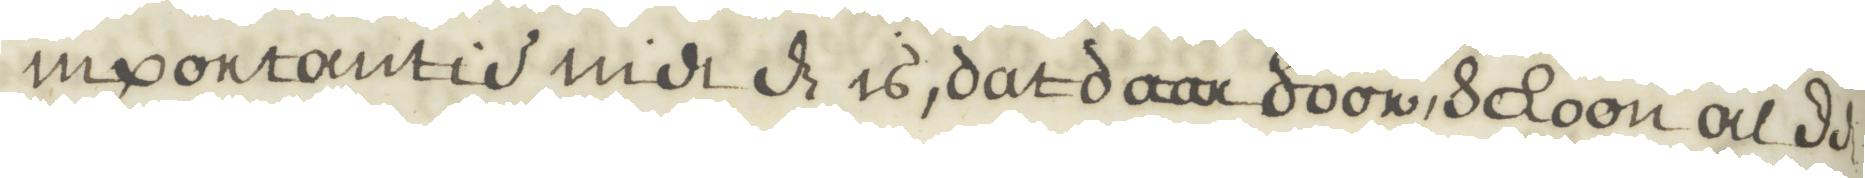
inportantie niet en is, dat daar door, schoon al een
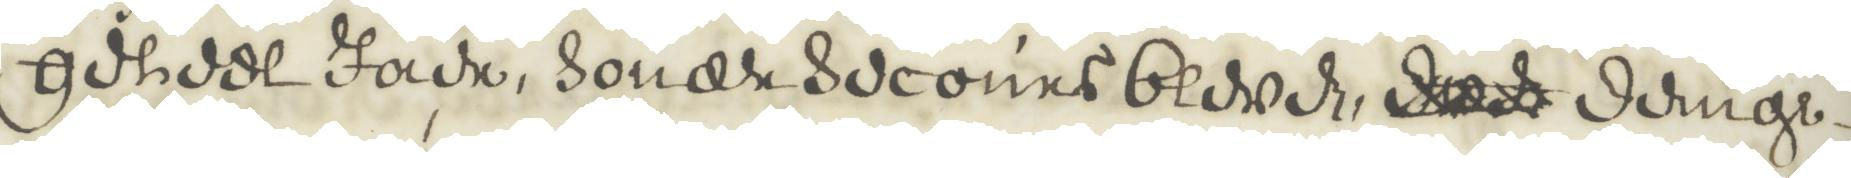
geheel Iaer, sonder secours bleven, end eenige
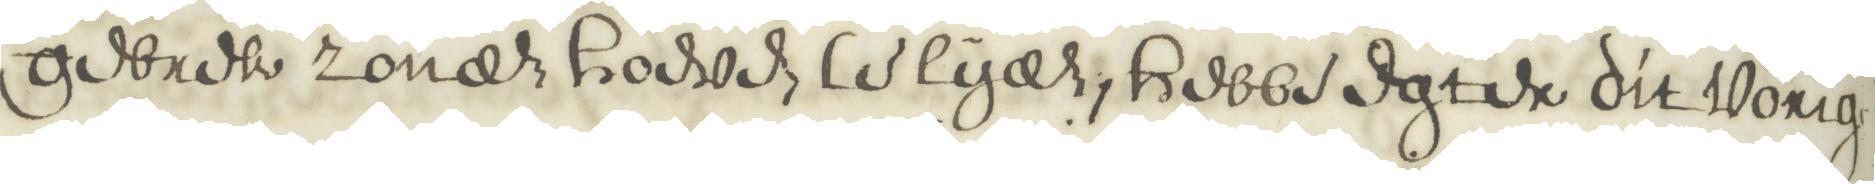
gebrek zouden hoeven te lijden, hebbe egter dit vorig
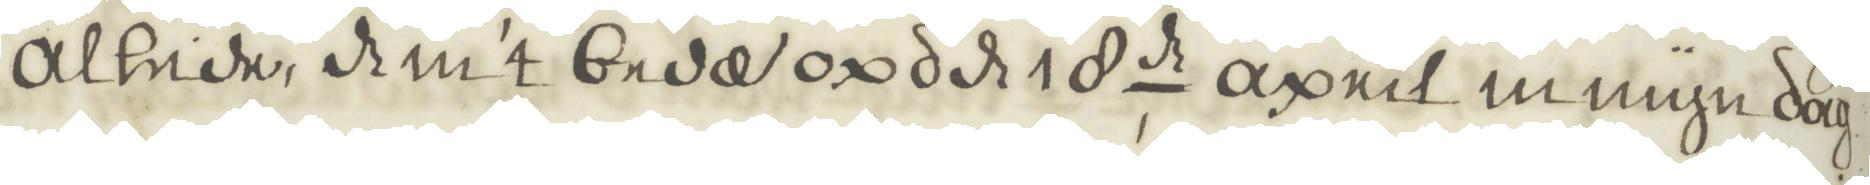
alhier, en in ’t brede op den 18=en april in mijn dag
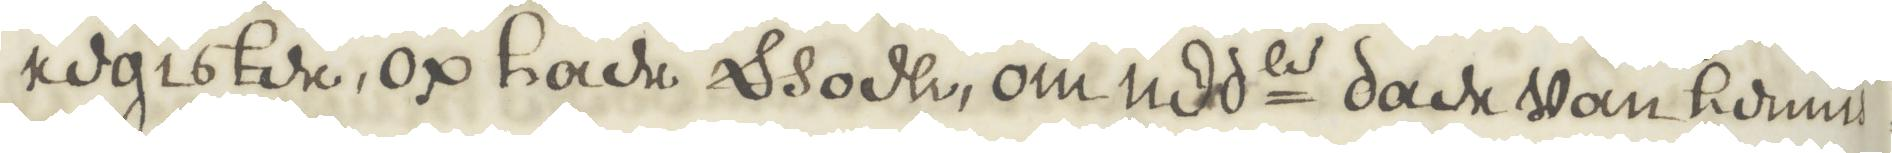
register, op haer versoek, om uEd=le daer van kennis
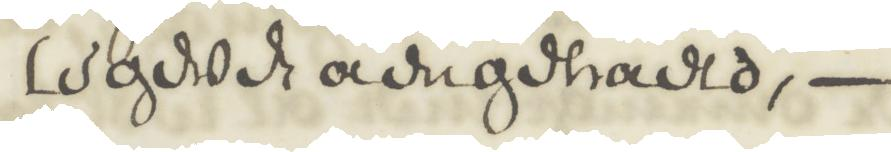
te geven aengehaeld, —
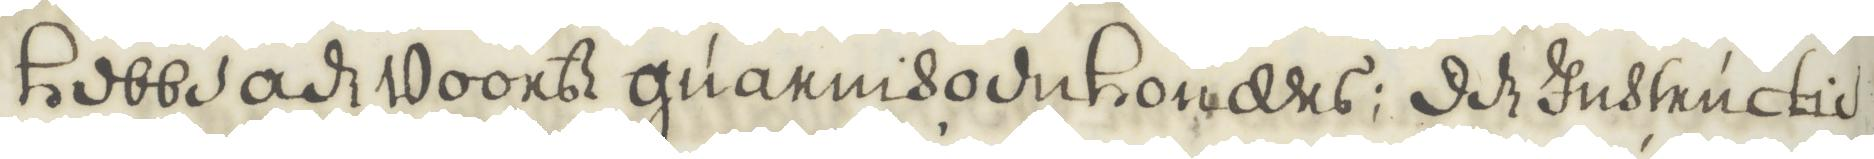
hebbe aen voorst guarnisoenhouders; den Instructie
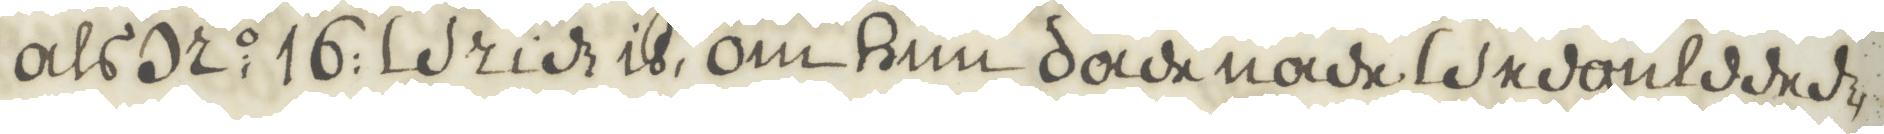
als N:o 16: tezien is, om hun daer naer te reguleeren,
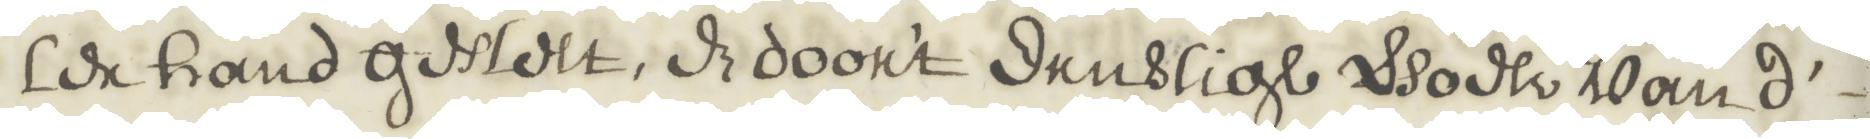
ter hand gestelt, en door ’t ernstigh versoek van d’ —
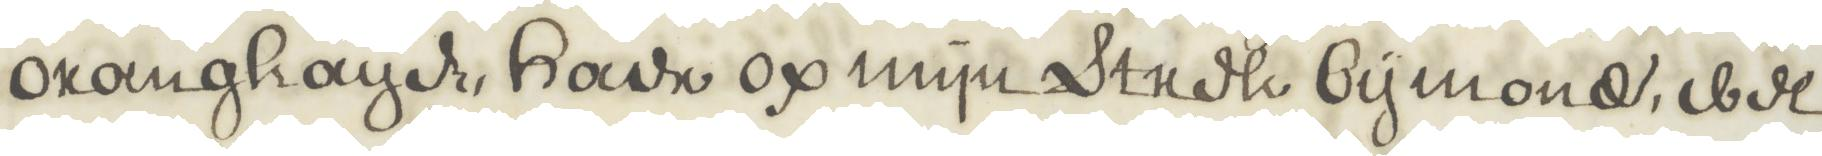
orangkayen, haer op mijn vertrek bij monde, wel
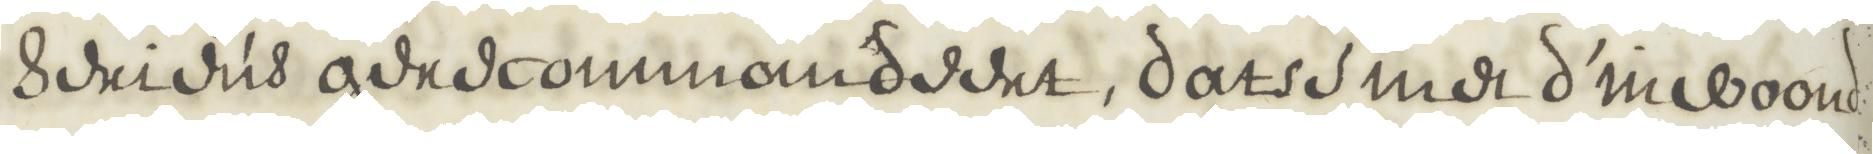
serieus gerecommandeert, datse met d’ inwoond
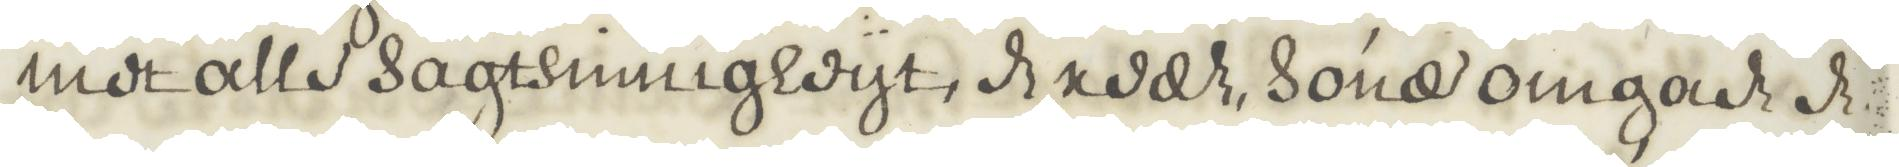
met alle sagtsinnigheijt, en reden, soude omgaen en
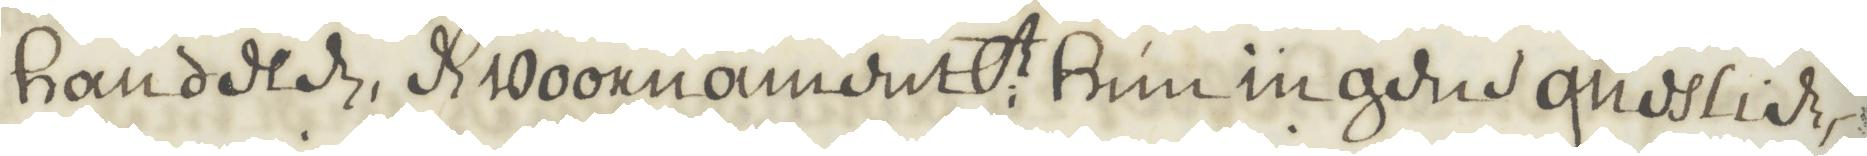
handelen, en voornamentlijk hun in gene questien,-
